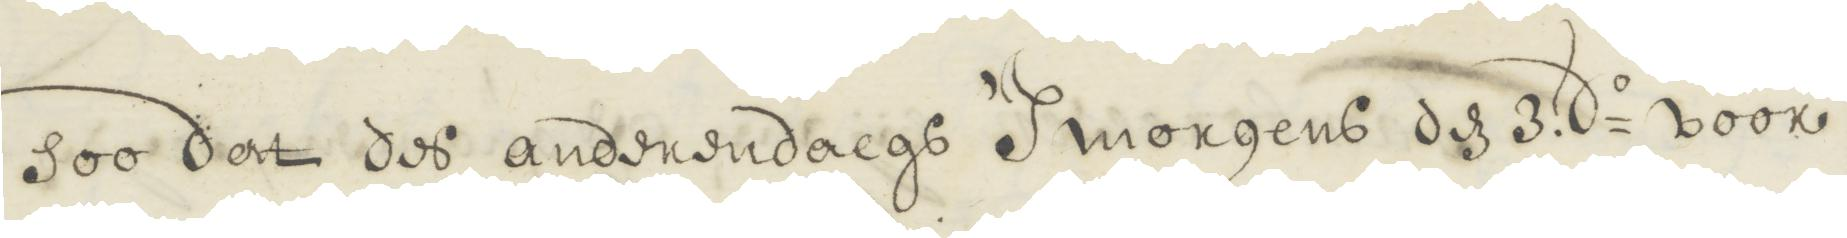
soo dat des anderendaegs 's morgens den 3.' d=o voor
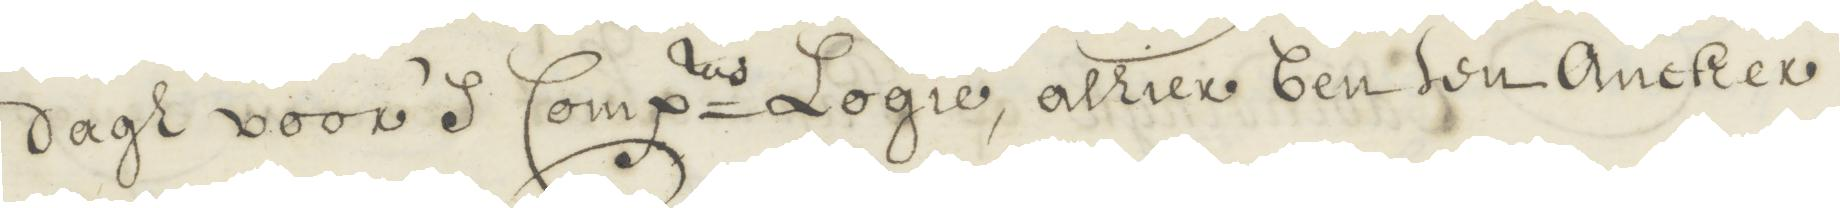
dagh voor ’s Comp=es Logie, alhier ben ten ancker
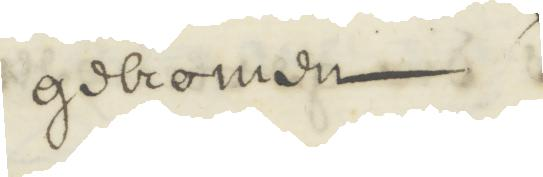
gekomen
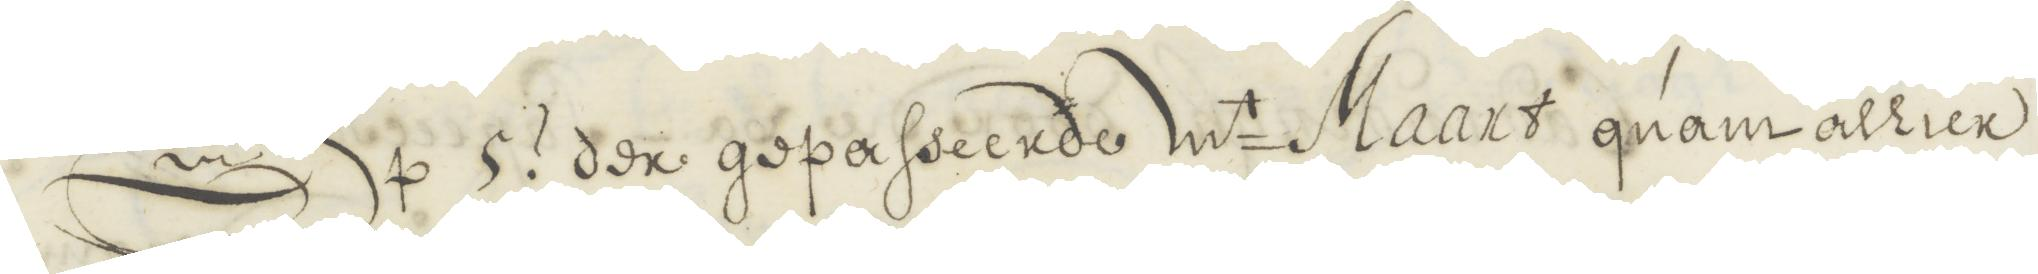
Op 5.' der gepasseerde m=t Maart quam alhier
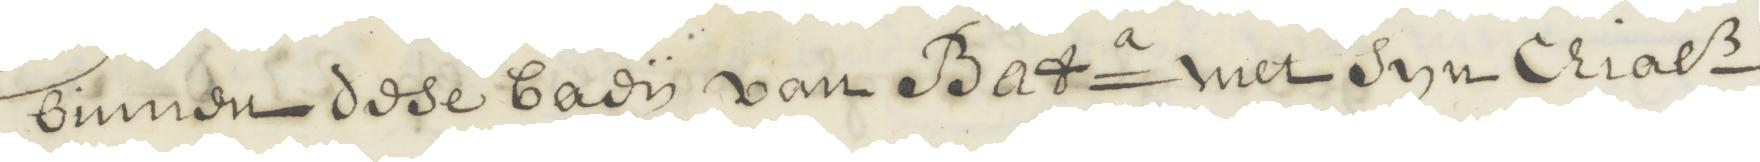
binnen dese baeij van Bat=a met syn Chial-z
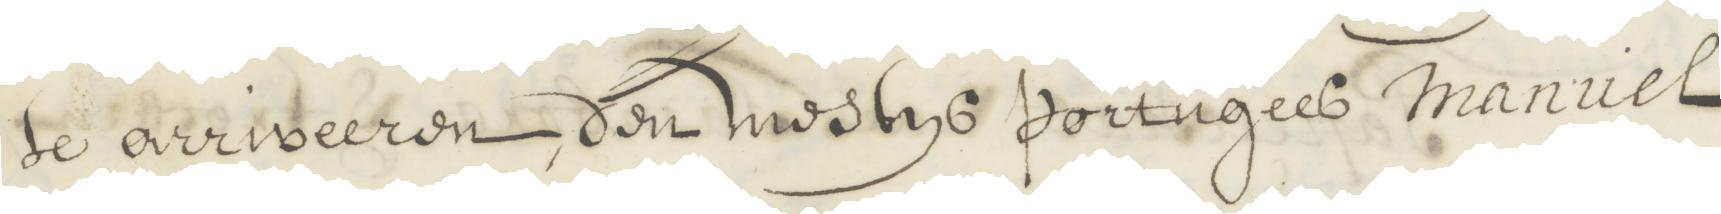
te arriveeren, den mestys portugees manuel
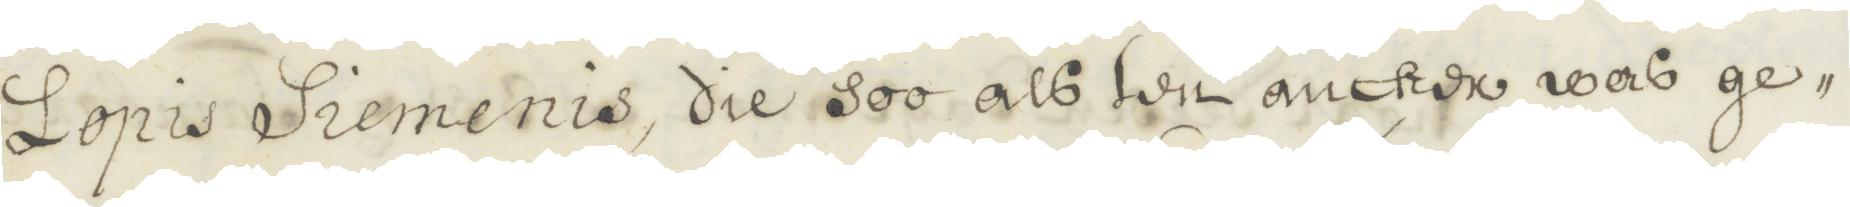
Lopis Siemenis, die soo als ten ancker was ge„
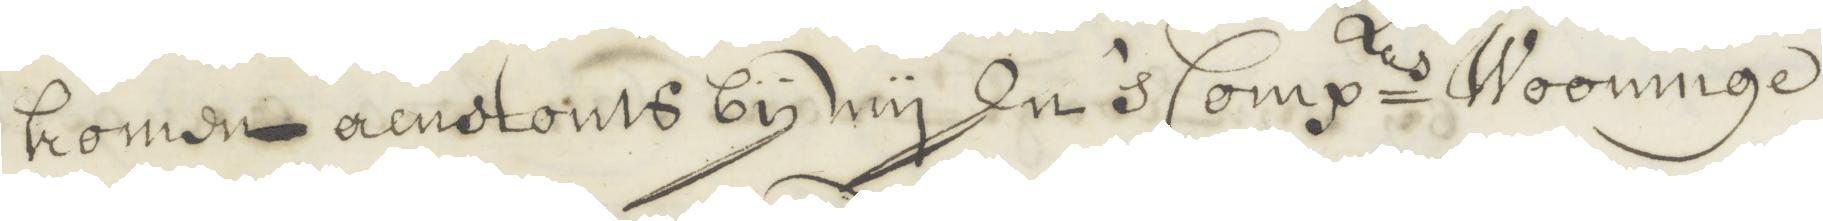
komen aenstonts bij mij Jn ’s Comp=es Wooninge
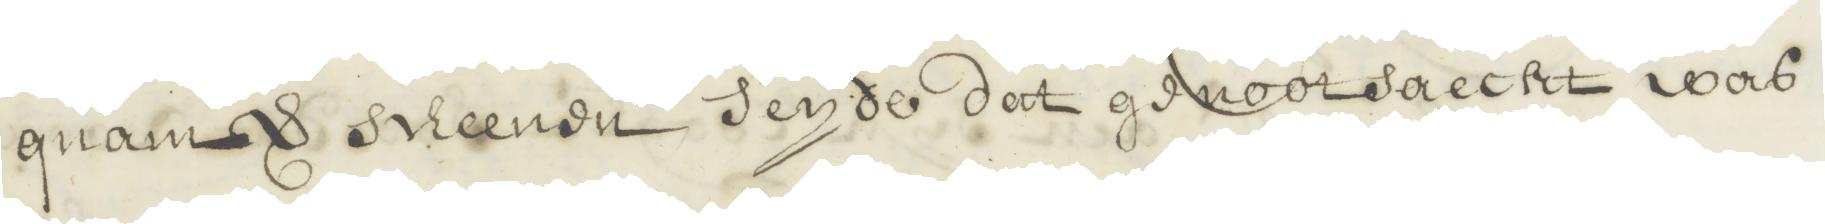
quam ver scheenen seyde dat genootsaeckt was
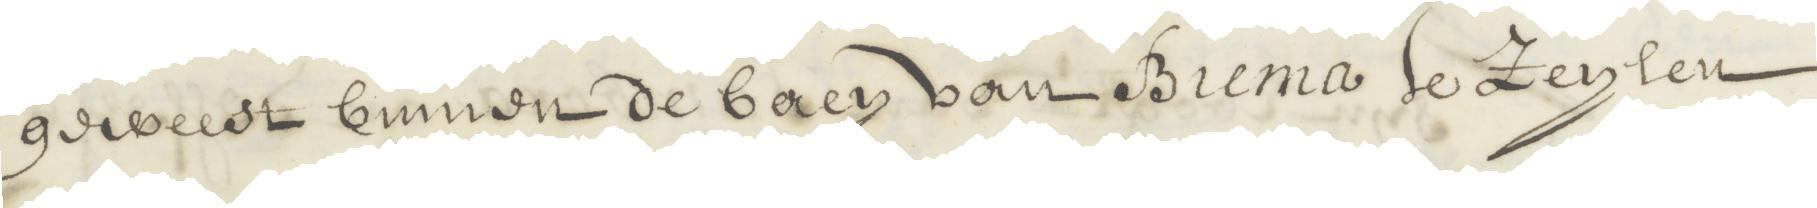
geweest binnen de baey van Biema te zeylen
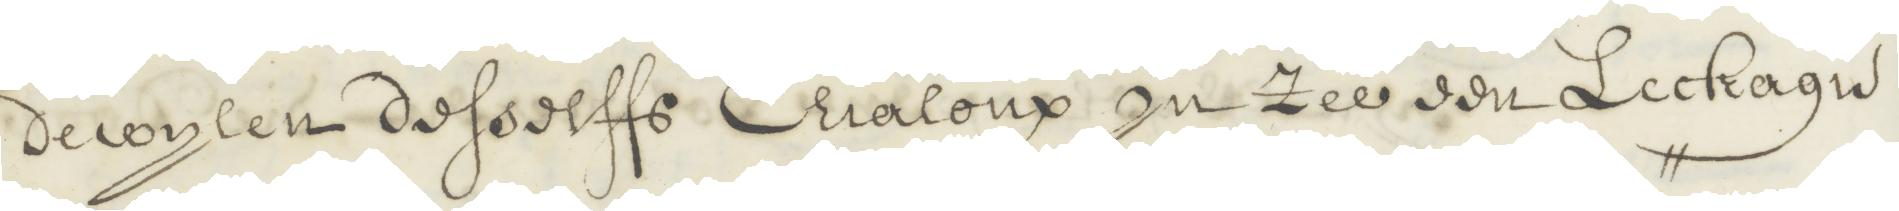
dewylen desselffs Chialoup jn zee een Leckagie
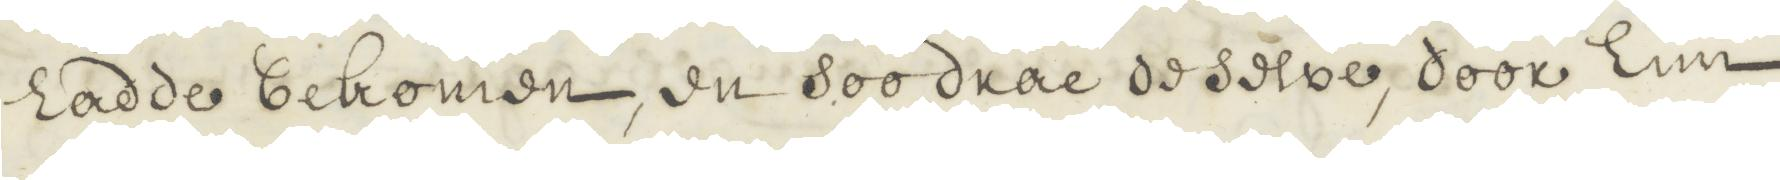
hadde bekomen, en soodrae deselve, door hun
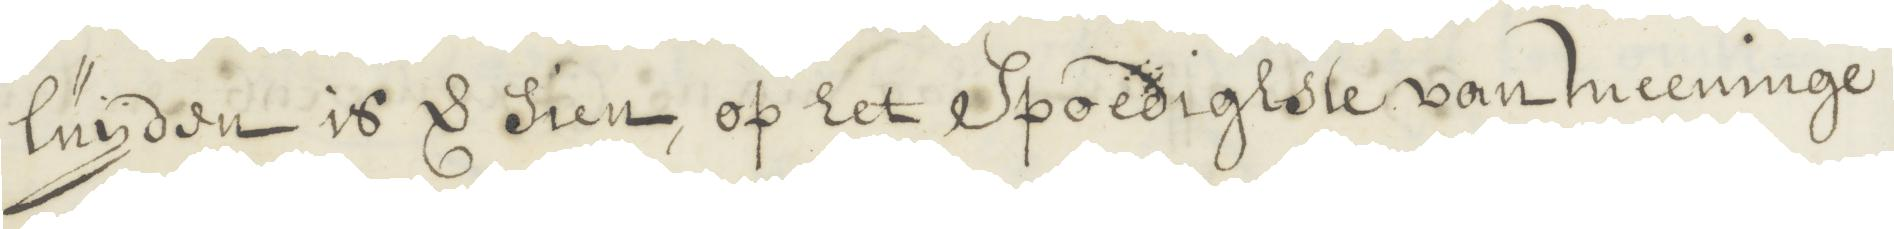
luijden is ver sien, op het spoedighste van meeninge
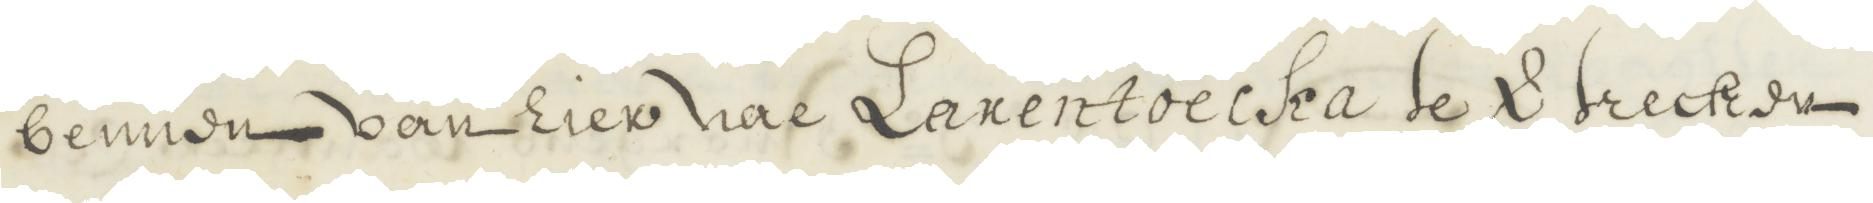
bennen van hier nae Larentoecka te vertrecken
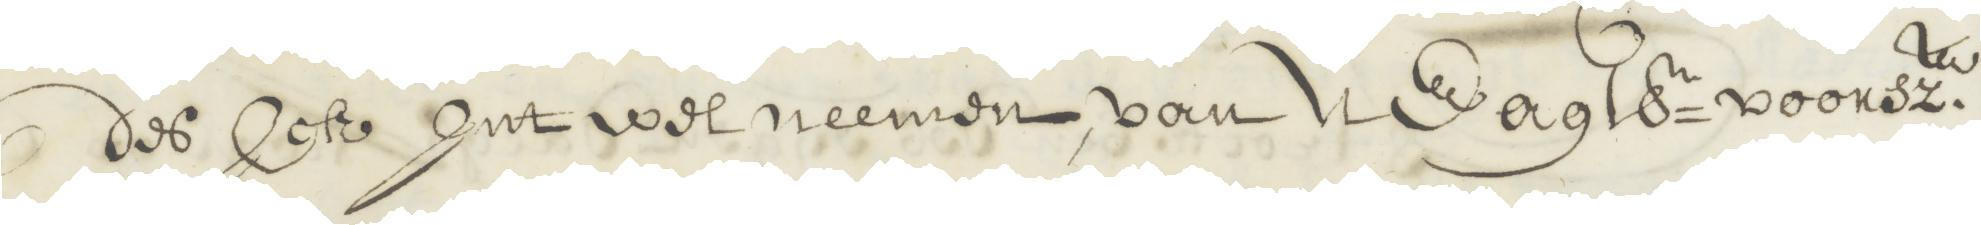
des jck jnt welneemen, van UE agtb=r voorsz.n
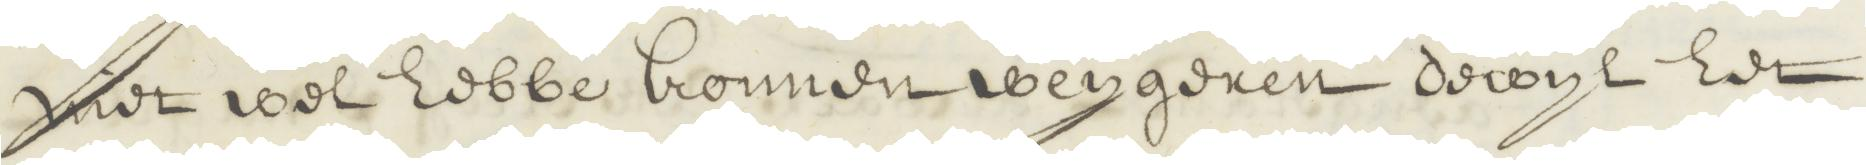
niet wel hebbe konnen weygeren dewyl het
